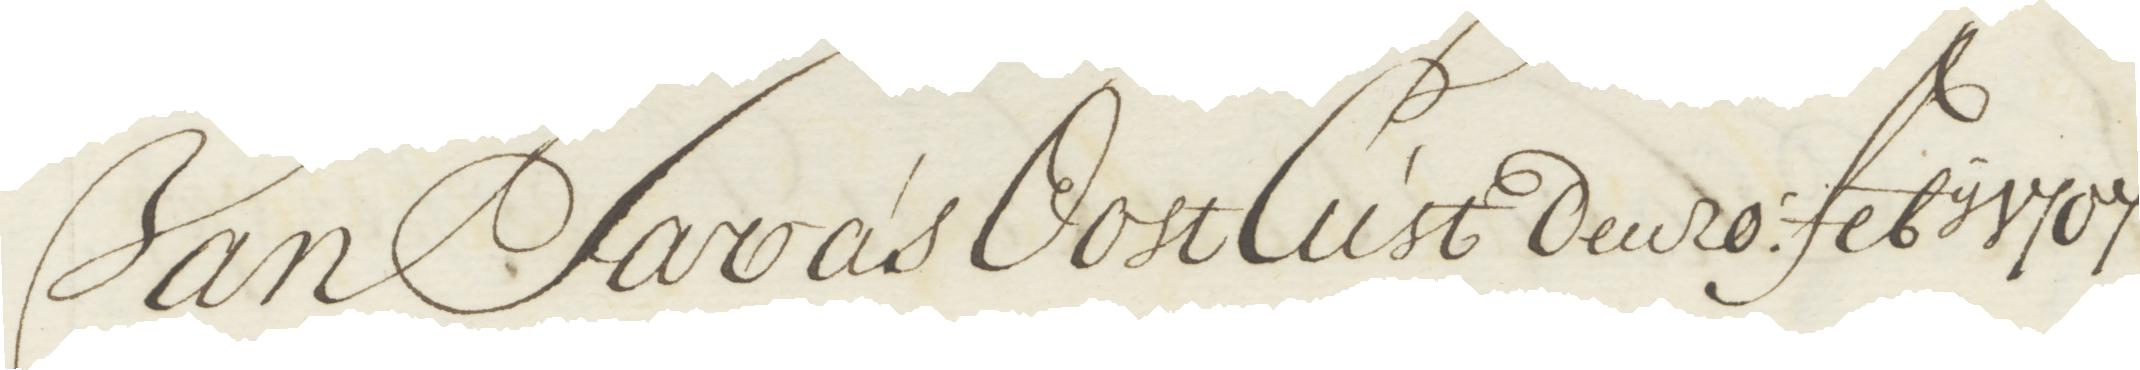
Van Java's Oost Cust den 20.' Febij 1707.
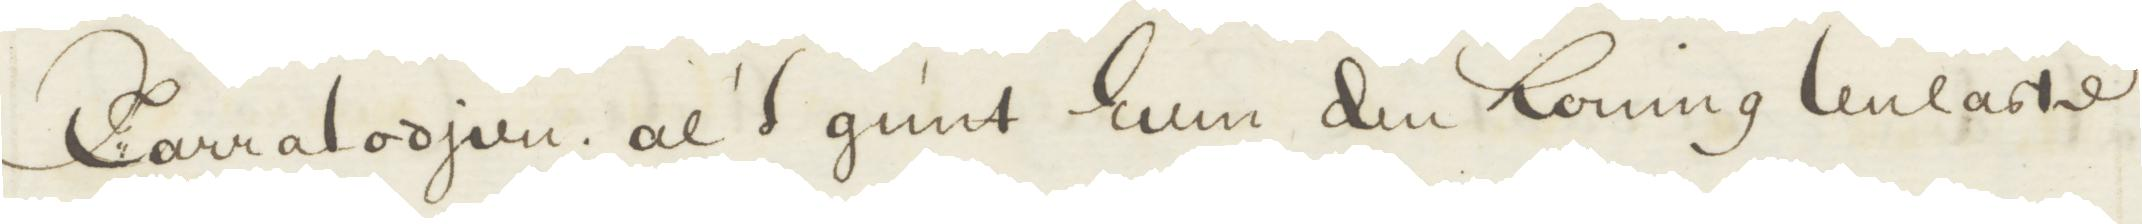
Carratodjen. al 't gunt hem den koning ten laste
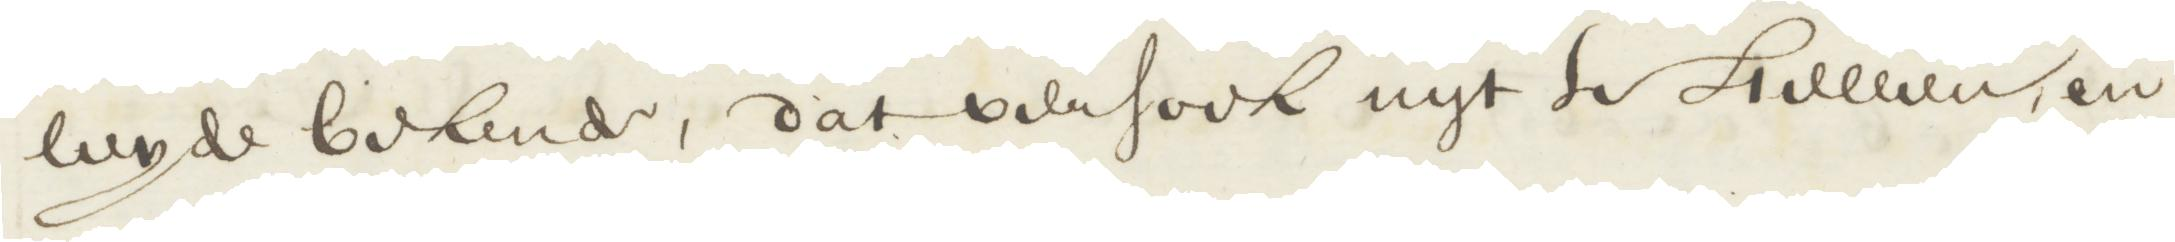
leijde bekende, dat versoek uijt te stellen, en
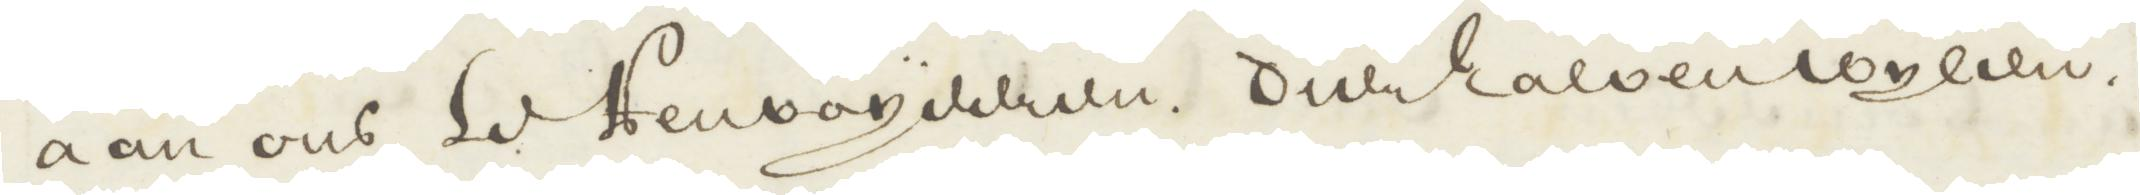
aan ons te Renvoijeeren, dierhalven wijlen.
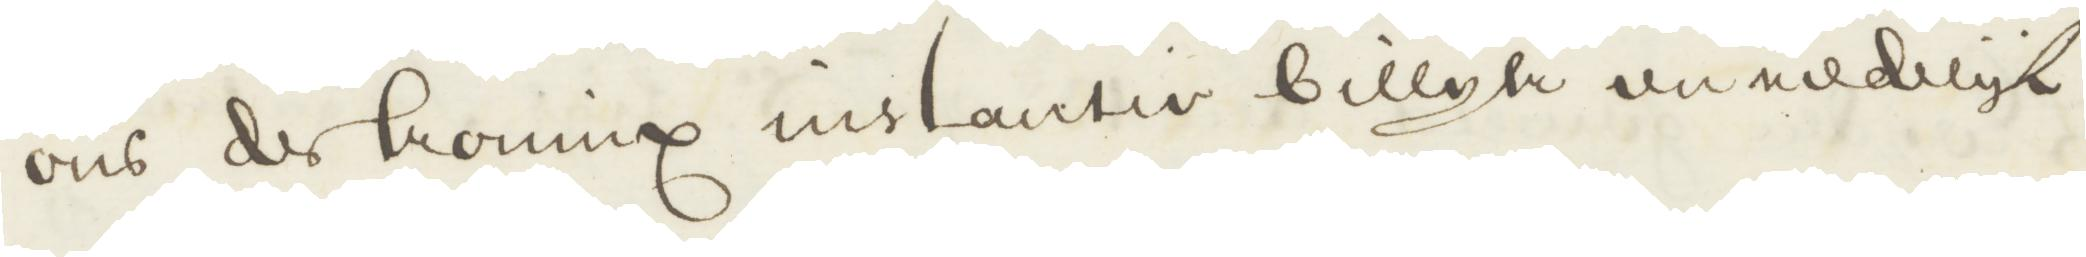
ons des koninx instantie billijk en redelijk
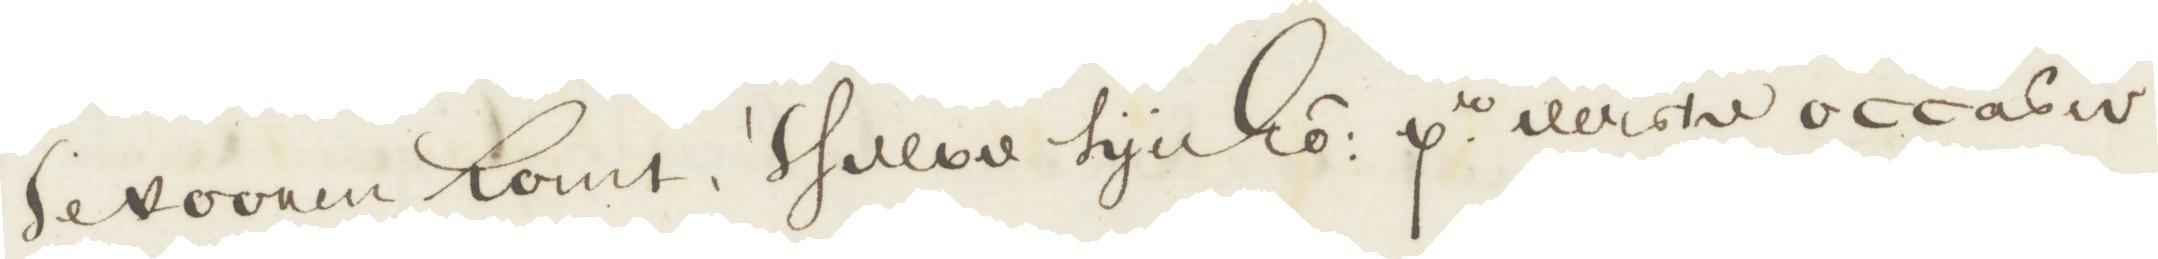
tevooren komt. 'tselve sijn hó: p.r eerste occasie
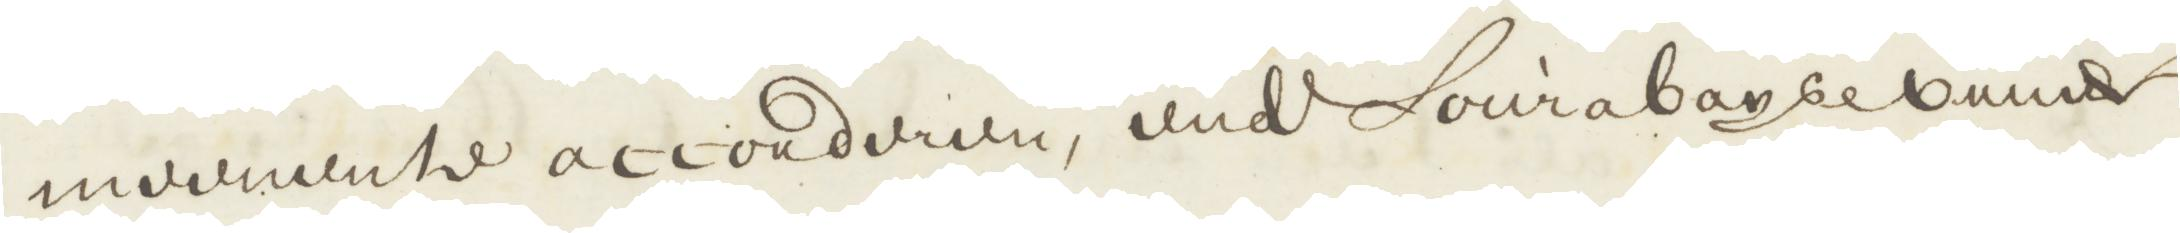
meenen te accorderen, ende Sourabaijse vrinde
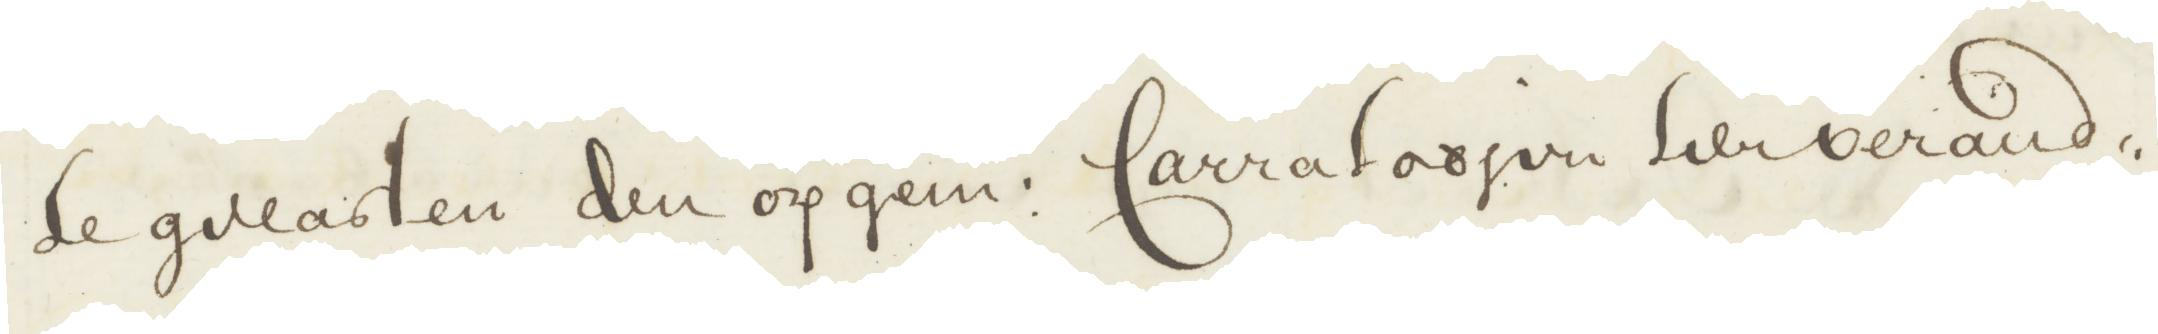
te gelasten den opgem: Carratodjen ter verand„
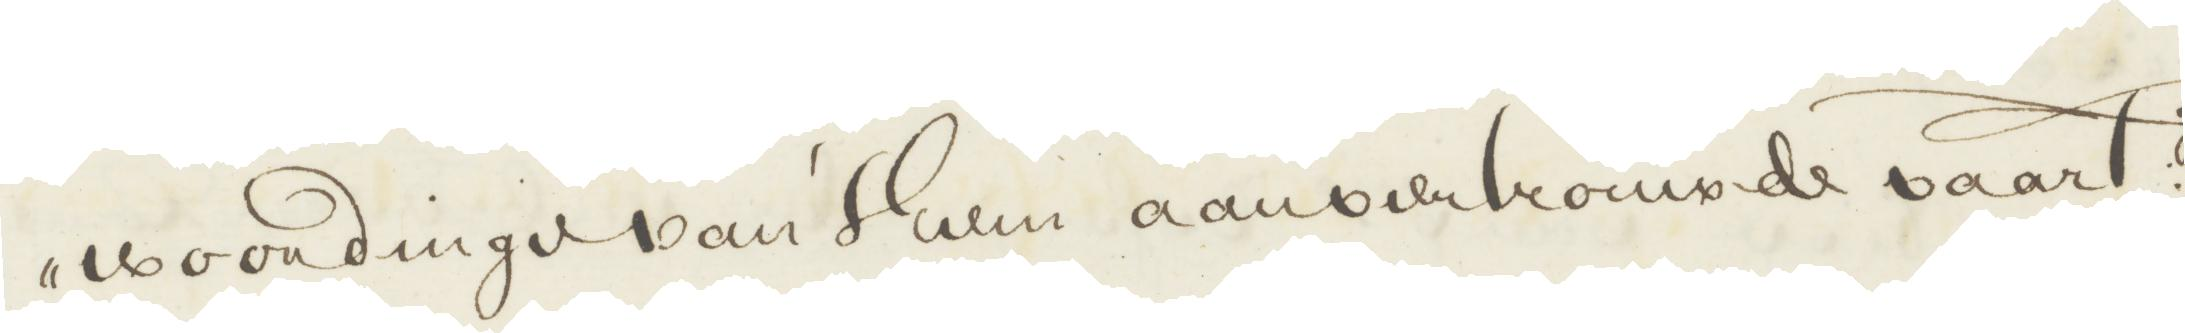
„woordinge van 't hem aanvertrouwde vaart:g
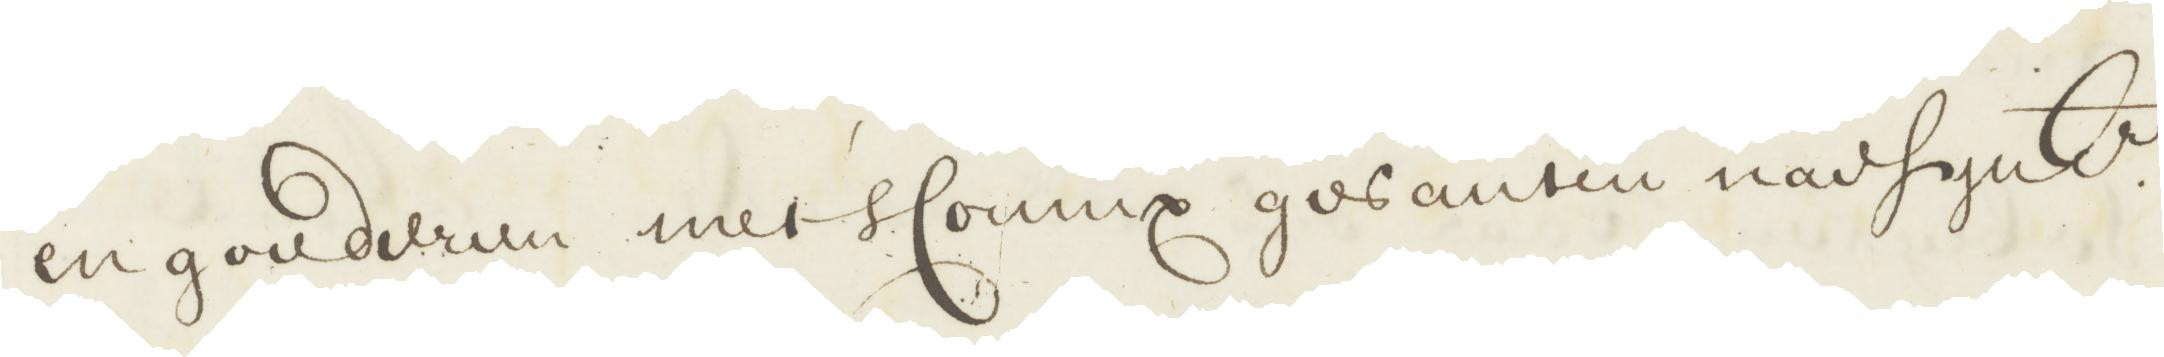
en goederen met 's Coninx gesanten nae sijn H.r
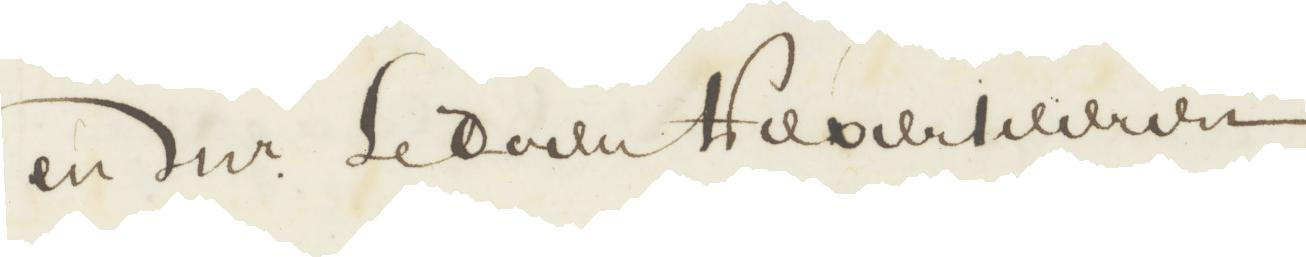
en m.r te doen reverteeren
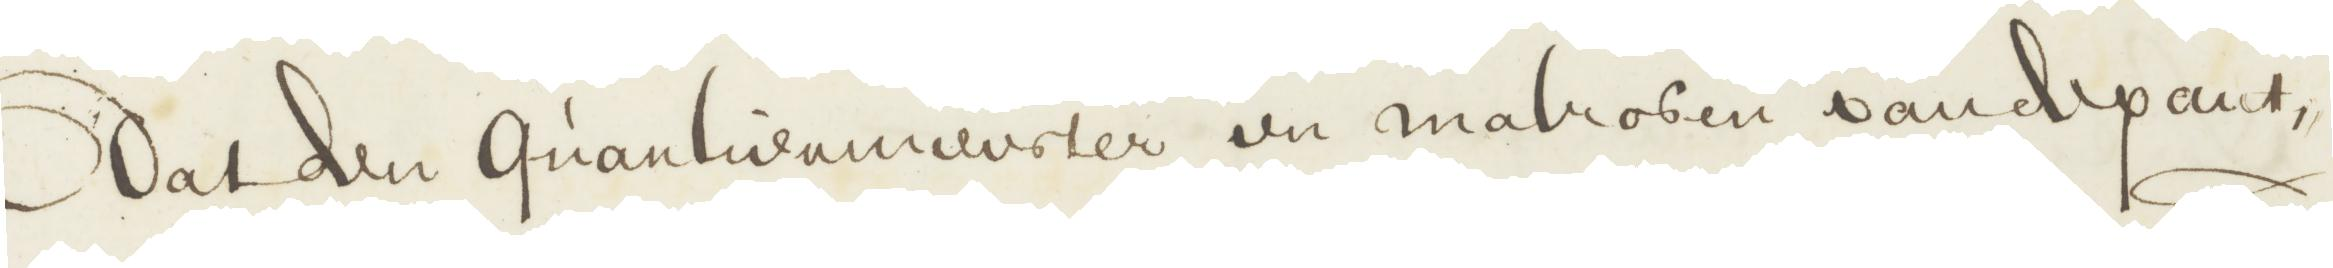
Dat den quartiermeester en matrosen van de pant„
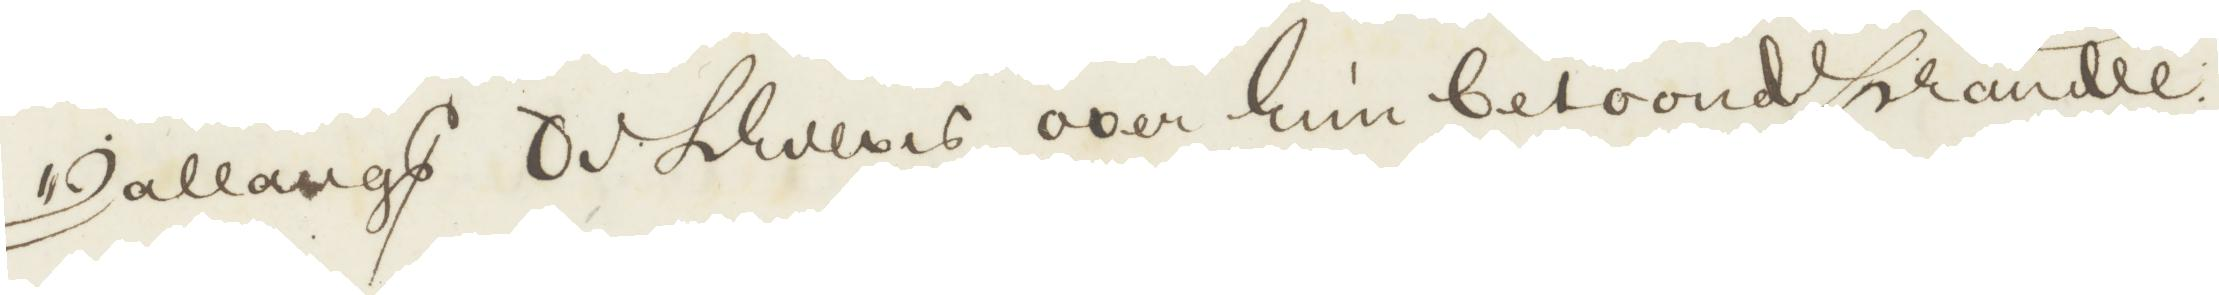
„jallangs de schelvis over hun betoonde schandel:
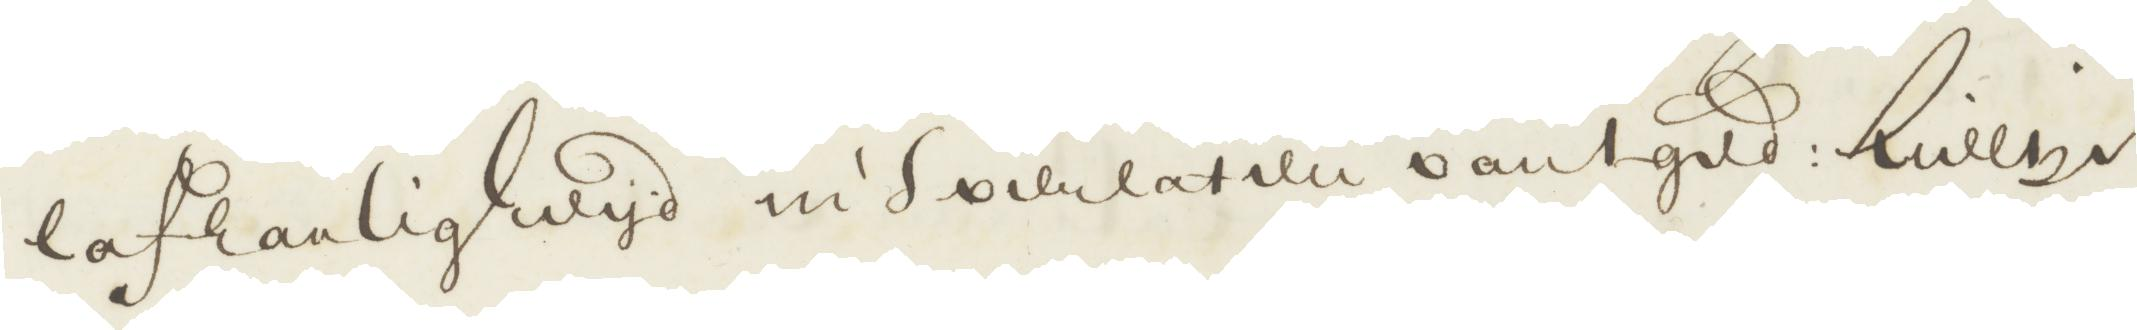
lafhartigheijd in 't verlaten van't ged: kieltje
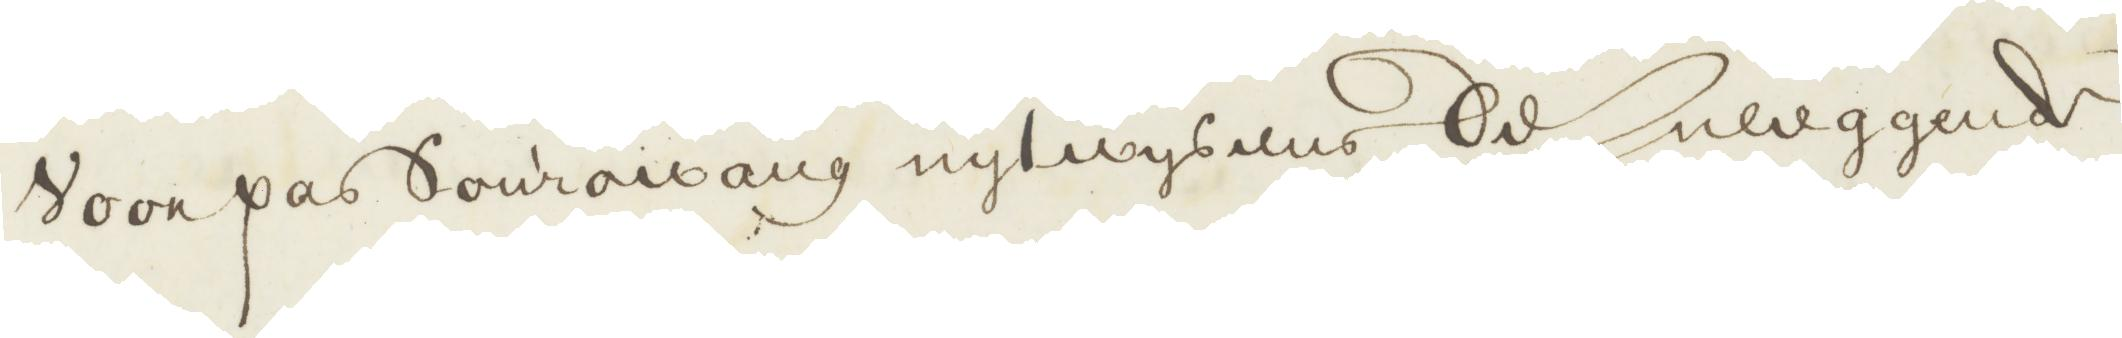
voor passourawang uijtwijsens de jnleggende
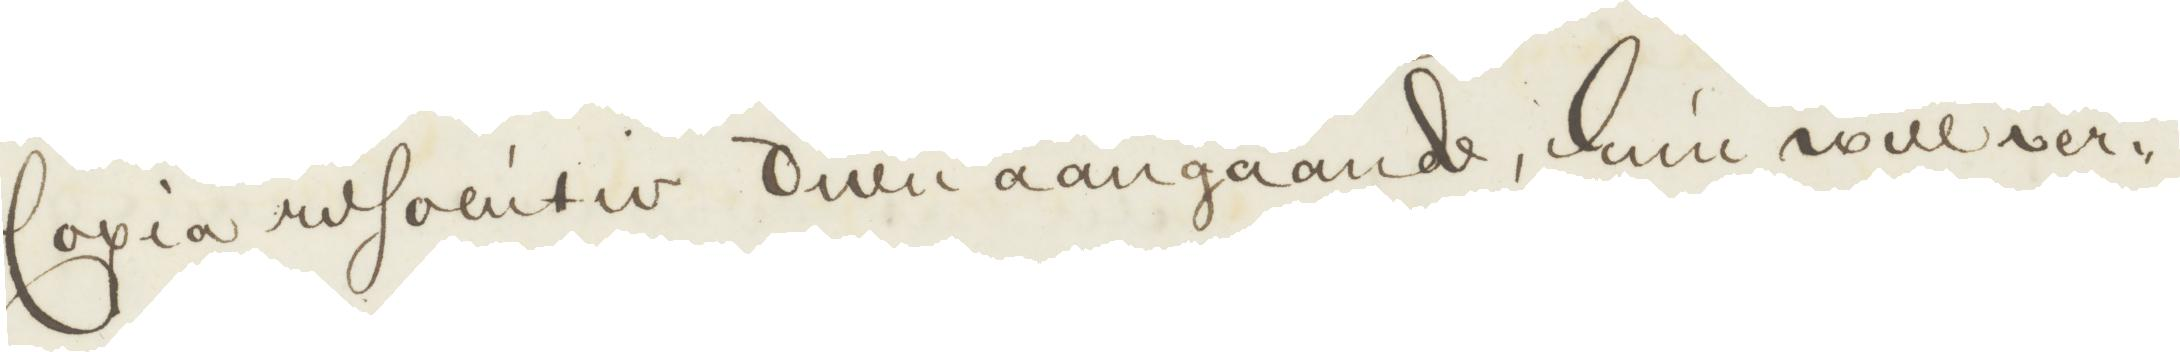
Copia resolutie dien aangaande, hun wel ver„
